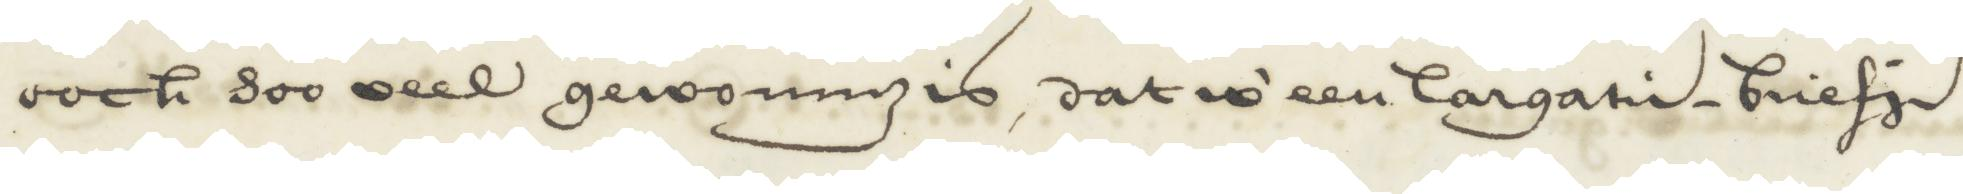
oock soo veel gewonnen is, dat w'een cargatie-briefje
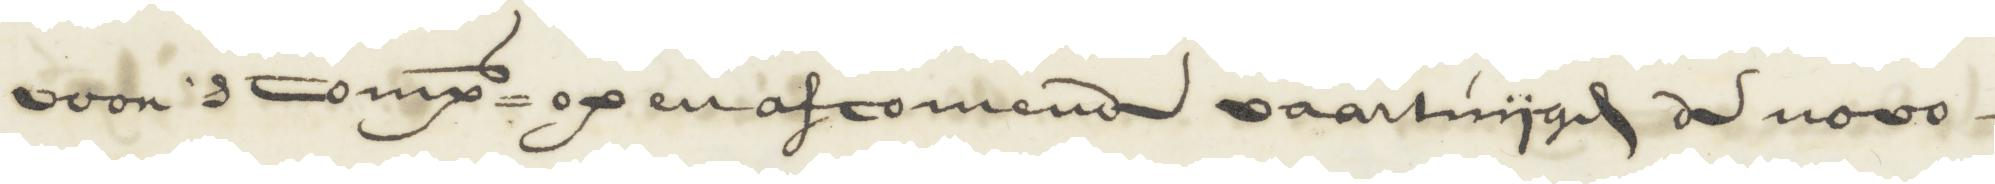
voor ’s Comp=s op en afcomende vaartuijgen de novo
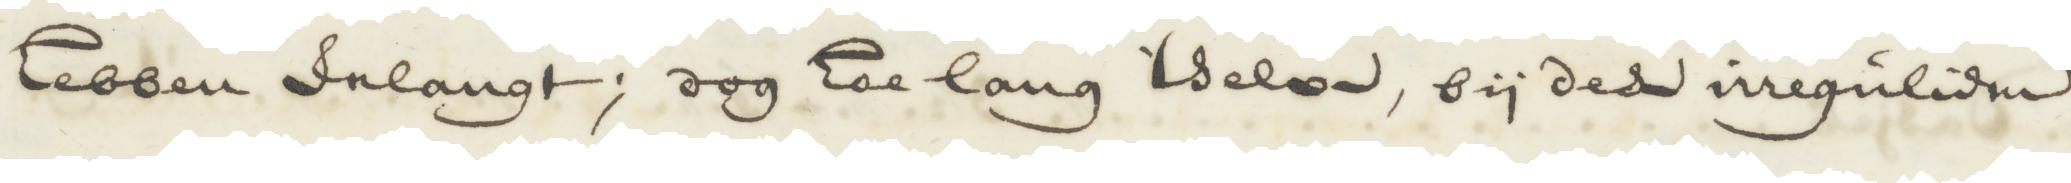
hebben erlangt; dog hoe lang 'tselve, bij dese irreguliere
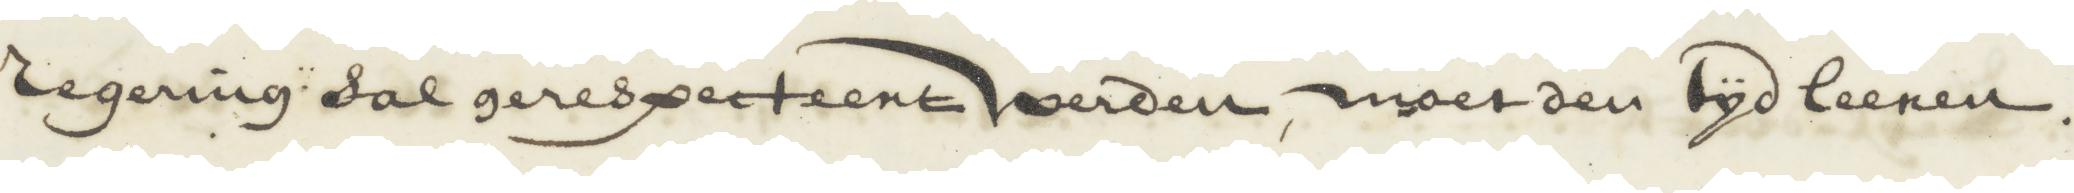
regering sal gerespecteert werden, moet den tijd leeren.
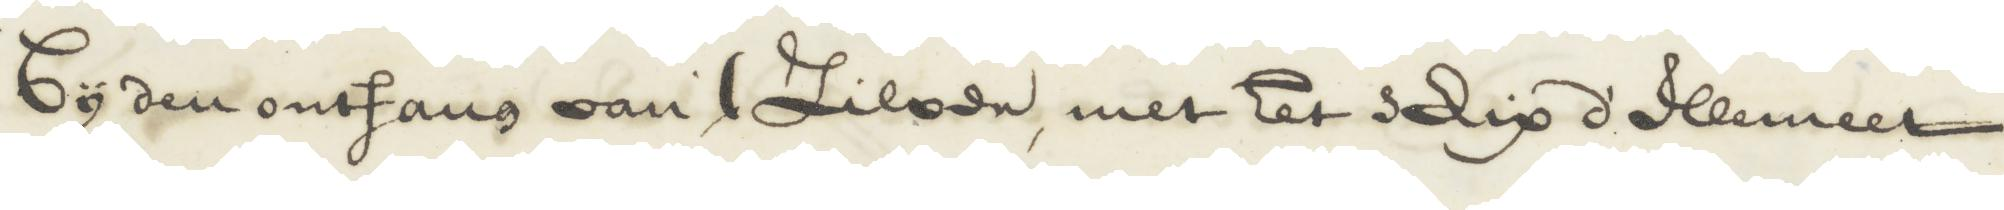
bij den ontfang van ’t Zilver, met het schip d’ Ellemeet
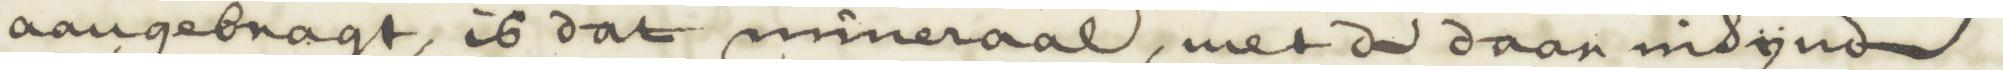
aangebragt, is dat mineraal, met de daar insijnde
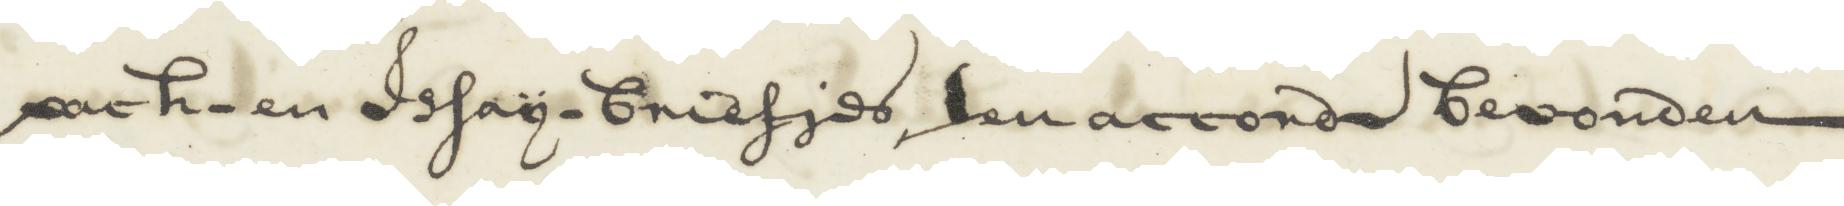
pack- en essaij-briefjes, ten accorde bevonden
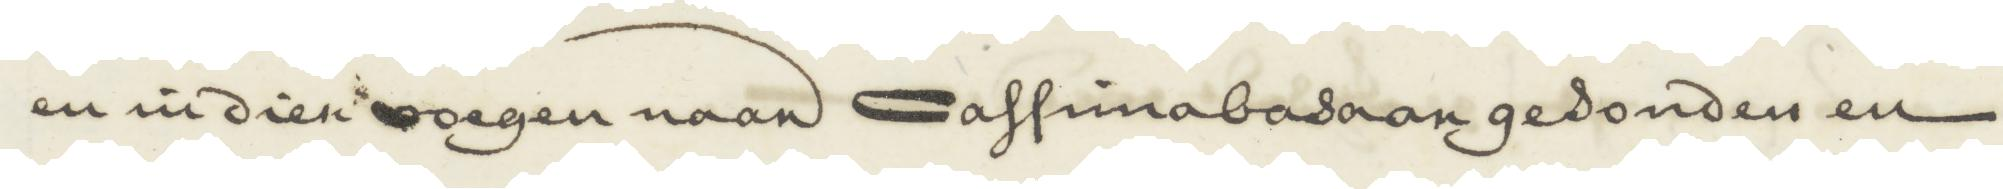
en in dien voegen naar Cassimabasaar gesonden en
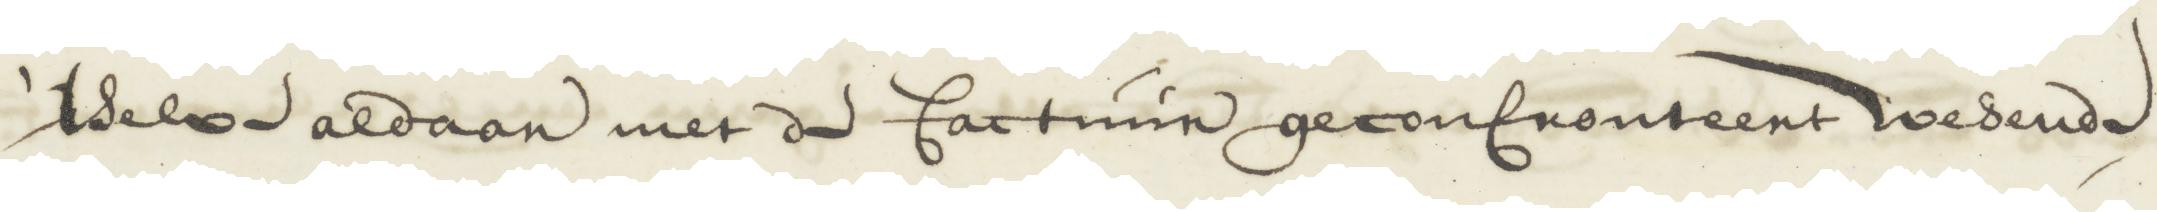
't selve aldaar met de factuur geconfronteert wesende,
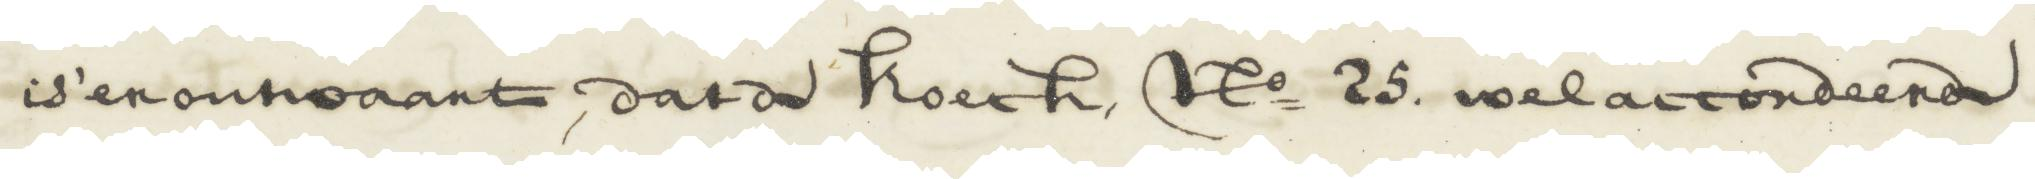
is'er ontwaart, dat de koeck, N=o 25. wel accordeerde
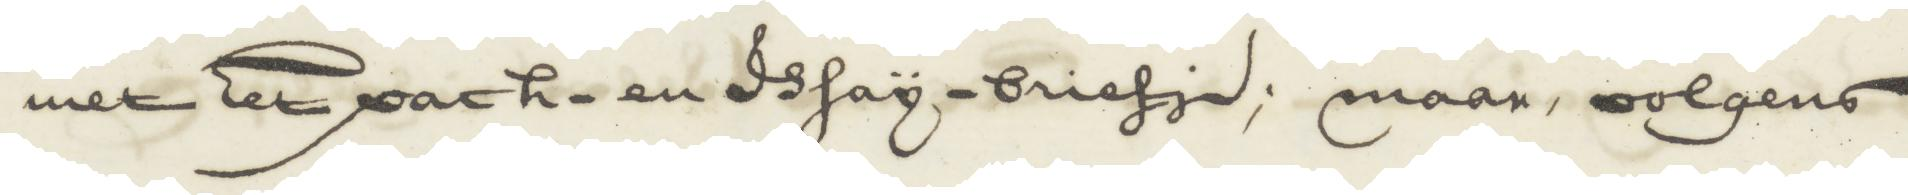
met het pack- en essaij-briefje; maar, volgens
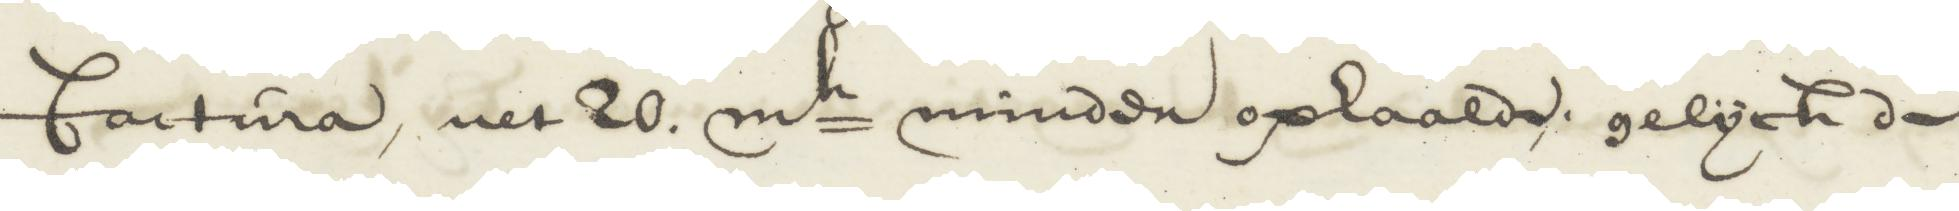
factura, net 20. m=k minder ophaalde; gelijck de
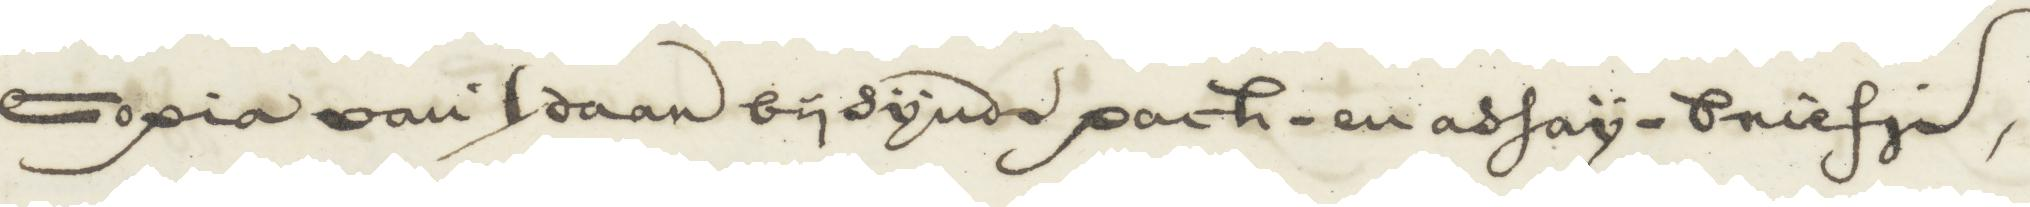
copia van 't daar bij sijnde pack- en assaij-briefje,
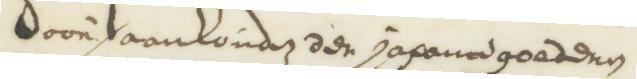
door 't aanhouden den japanse goederen
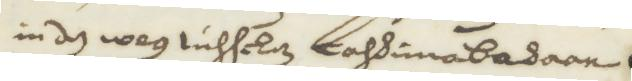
in den weg tusschen cassunabasaan,
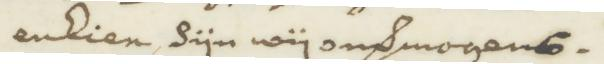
en hier sijn wij onvermogens.
